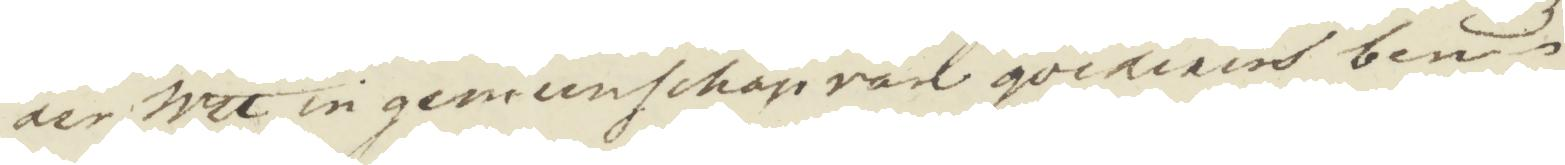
der wet in gemeenschap van goederen ben
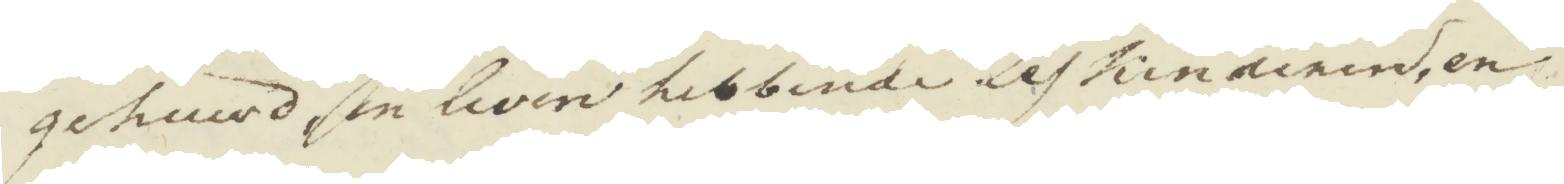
gehuwd, in leven hebbende zes kinderen, en
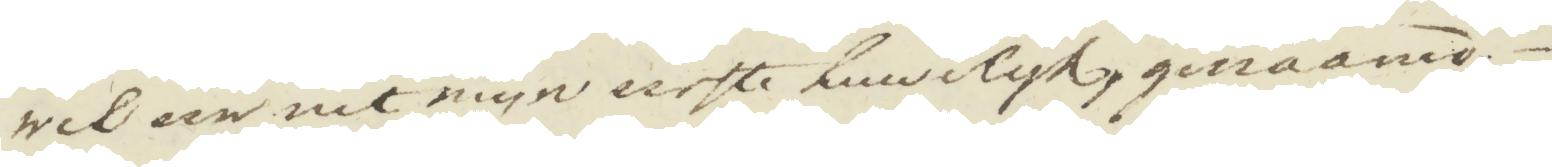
wel een uit myn eerste huwelyk, genaamd.
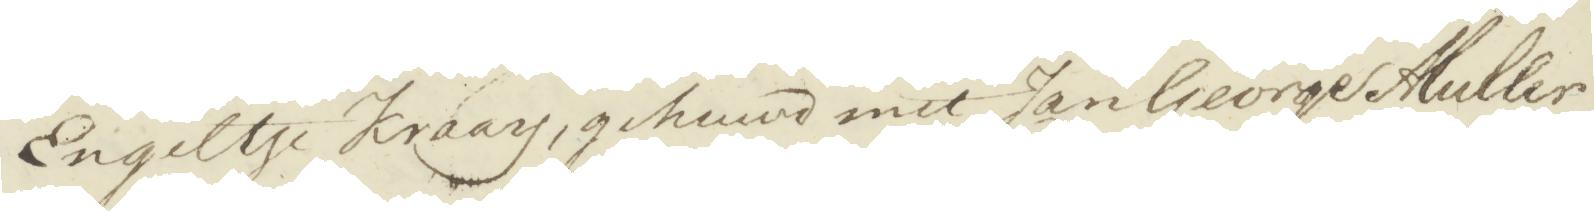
Engeltje Kraay, gehuwd met Jan Greorge Muller
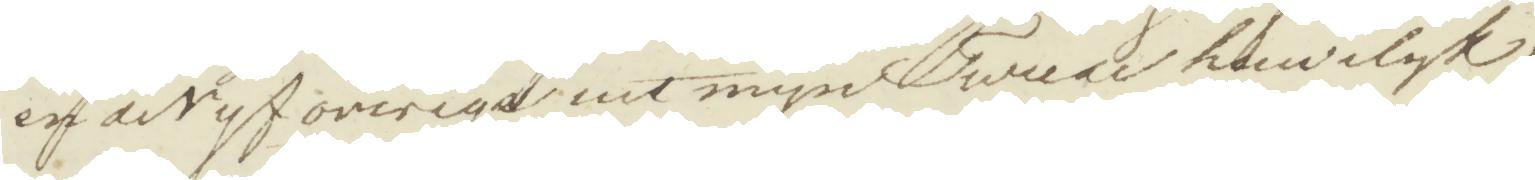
en de vyf overige uit myn Tweede huwelyk
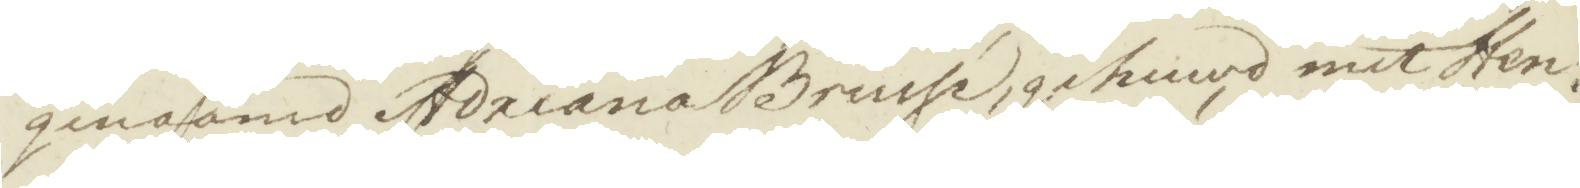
genaamd Adriana Brussé, gehuwd met Hen„
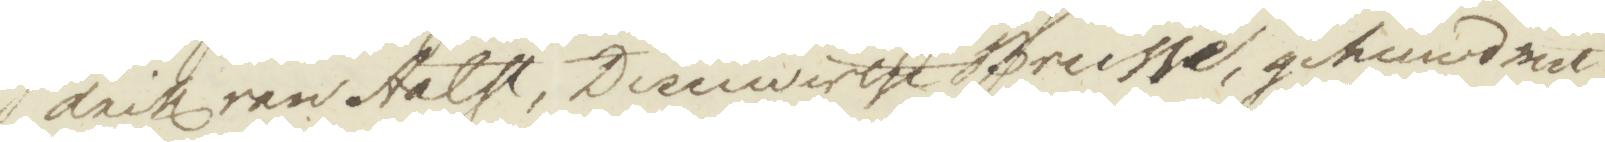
„drik van Aalst, Dieuwertje Brussé, gehuwd met
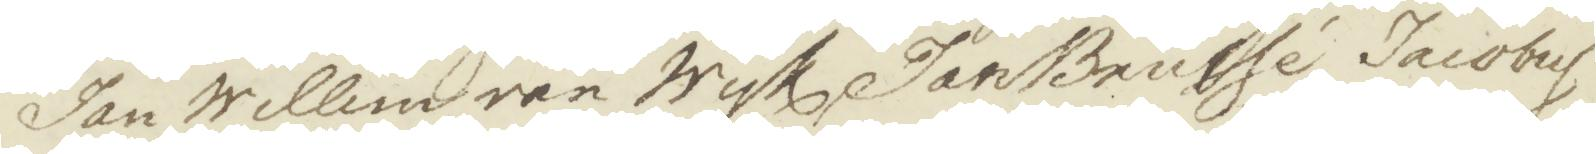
Ian Willem van Wyk, Ian Brussé, Iacobus
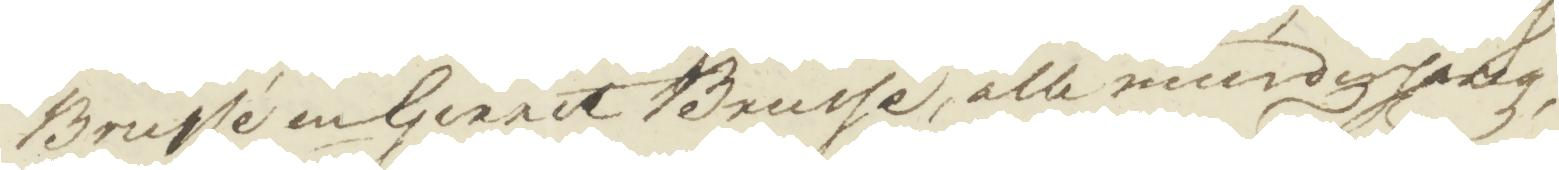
Brussé en Gerrit Brussé, alle meerderjarig,
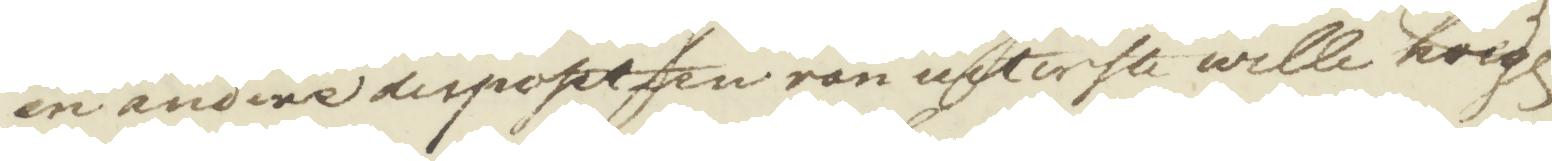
en andere dispositien van uiterste wille hoege
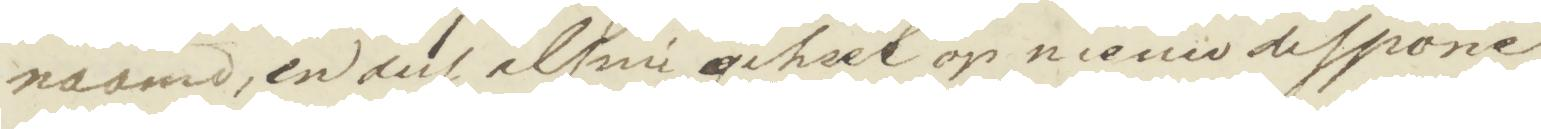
naamd, en dus alsnu geheel op nieuw dispone
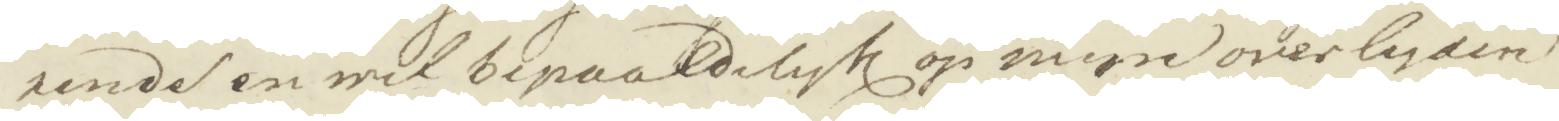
rende en wel bepaaldelyk op myn overlyden
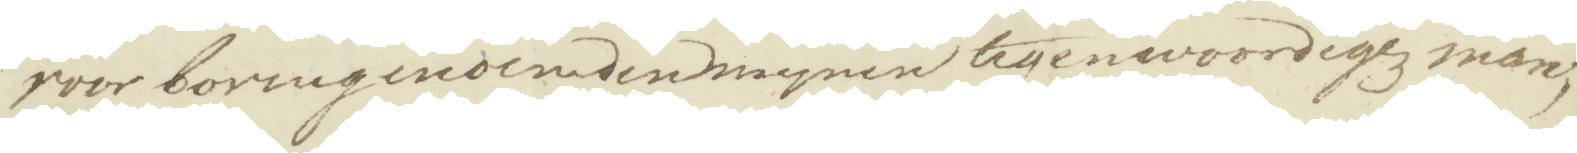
voor bovengenoemden mynen tegenwoordigen man,
